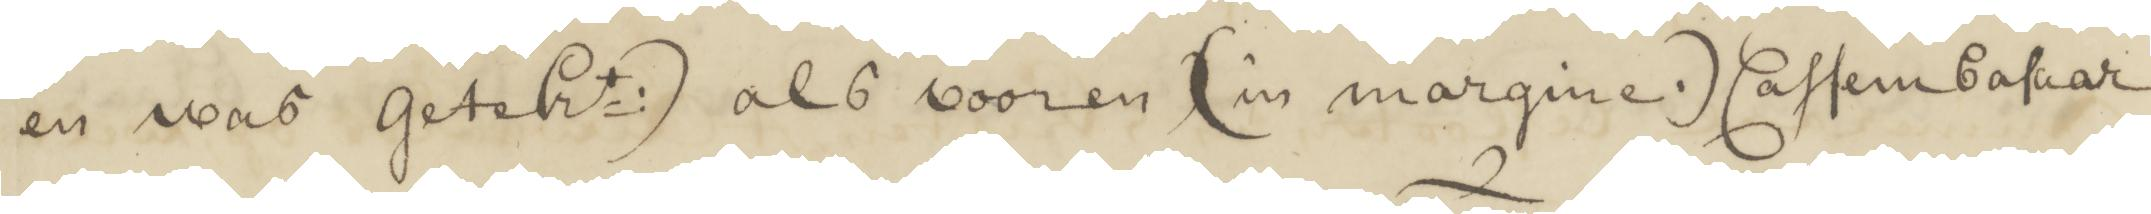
en was getek=t :) als vooren (in margine .) Cassembasaar
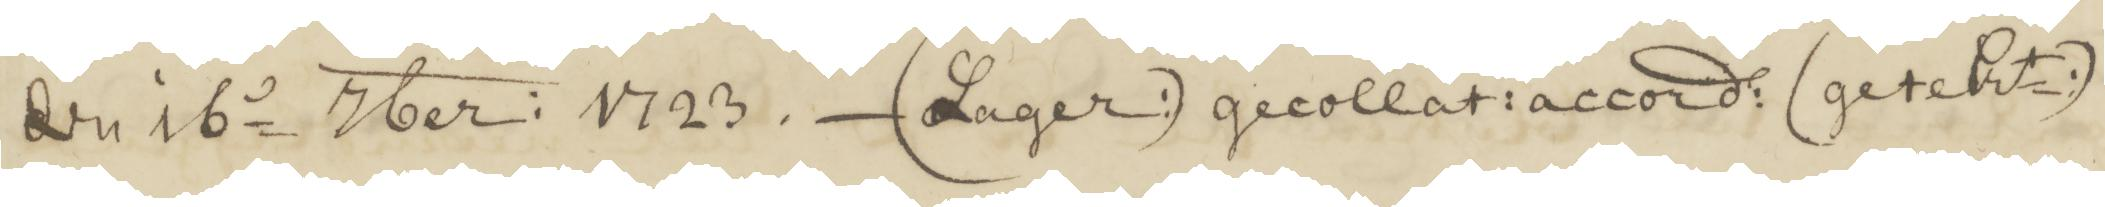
den 16=e 7ber: 1723. — (Lager :) gecollat: accord: (getek=t :)
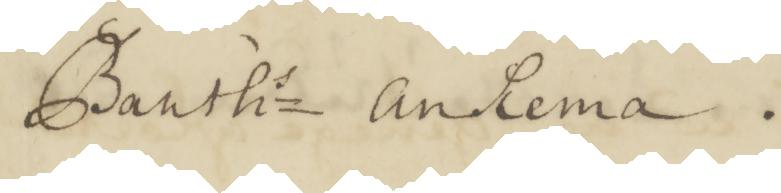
Barth=s Ankema.
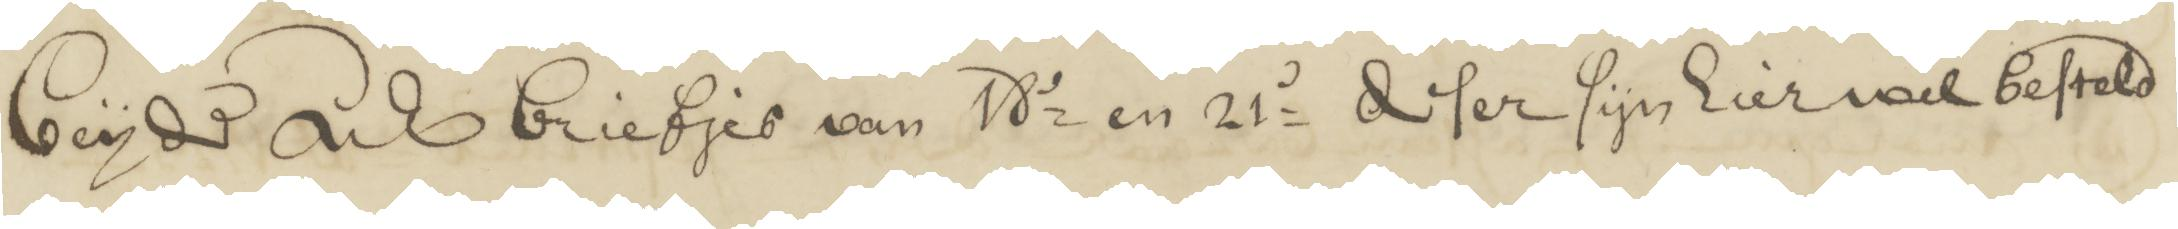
beijde VE briefjes van 18=' en 21=' deser sijn hier wel besteld
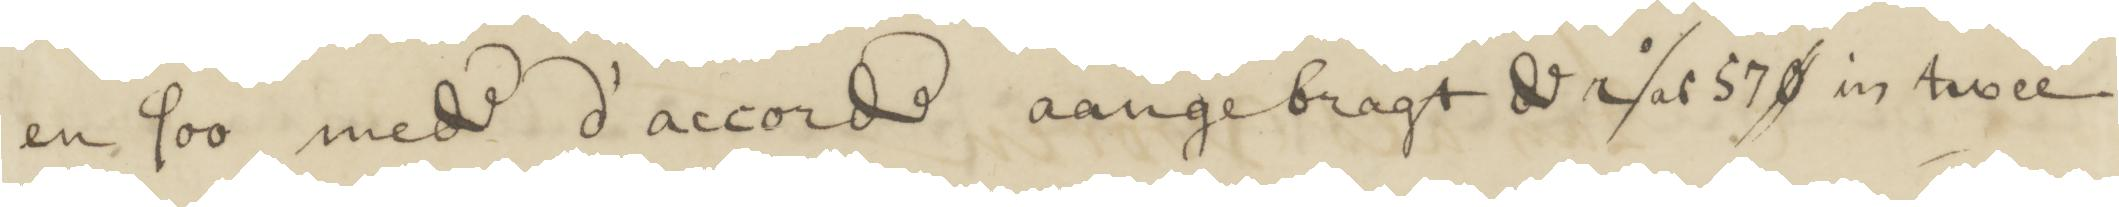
en soo mede d’accorde aangebragt de r/oas 57 Ø in twee
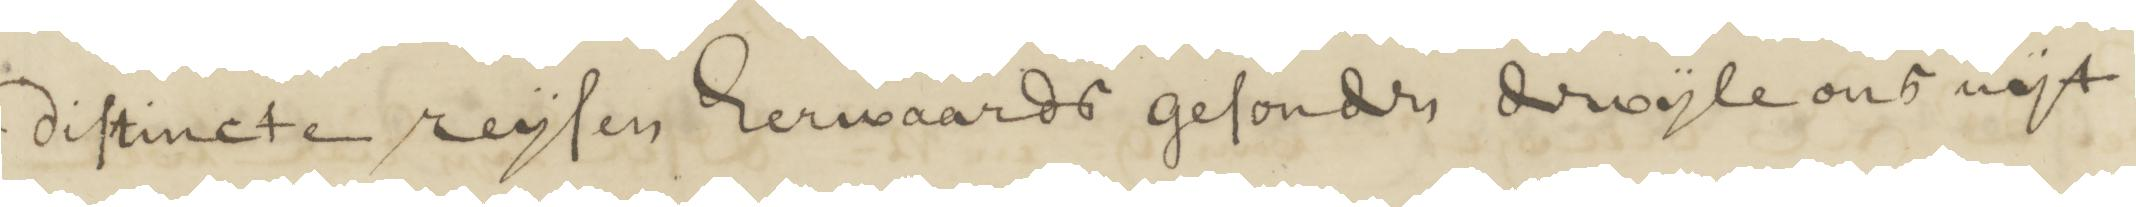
distincte reijsen herwaards gesonden dewijle ons uijt
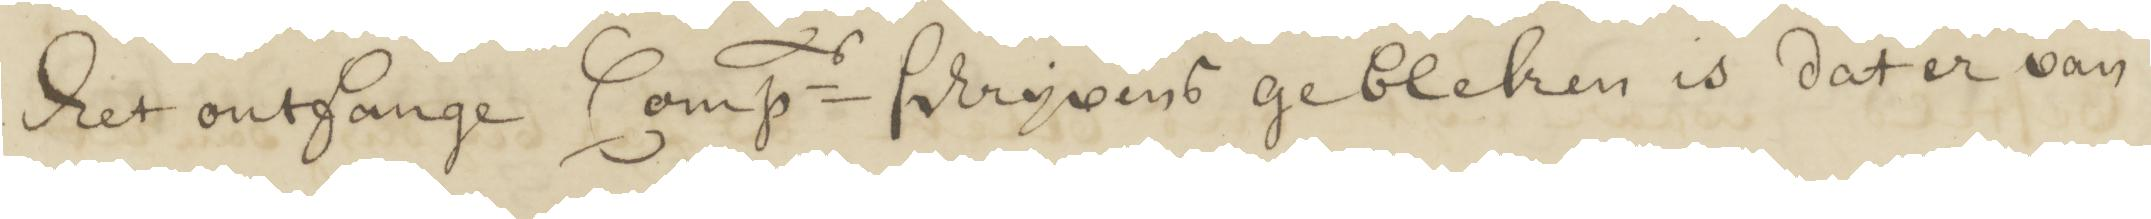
het ontfange Comp=s schrijvens gebleken is dat er van
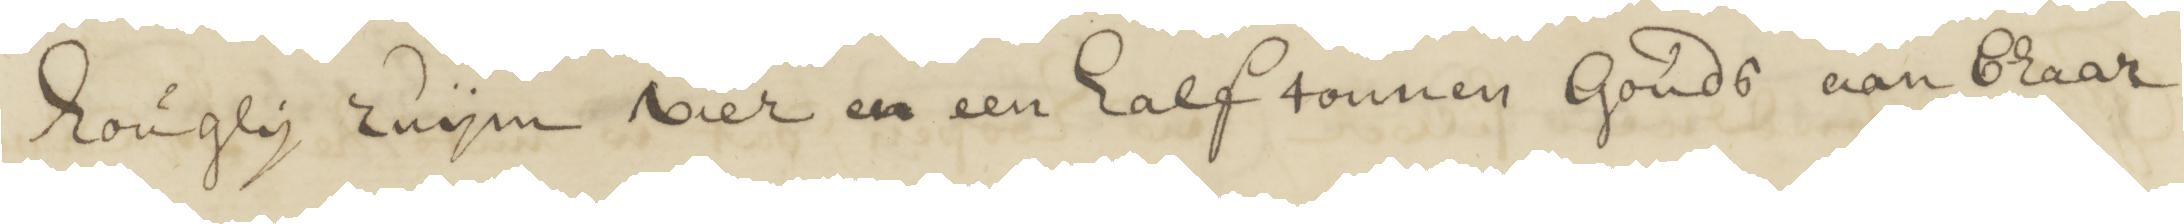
houglij ruijm vier en een half tonnen Gouds aan bhaar
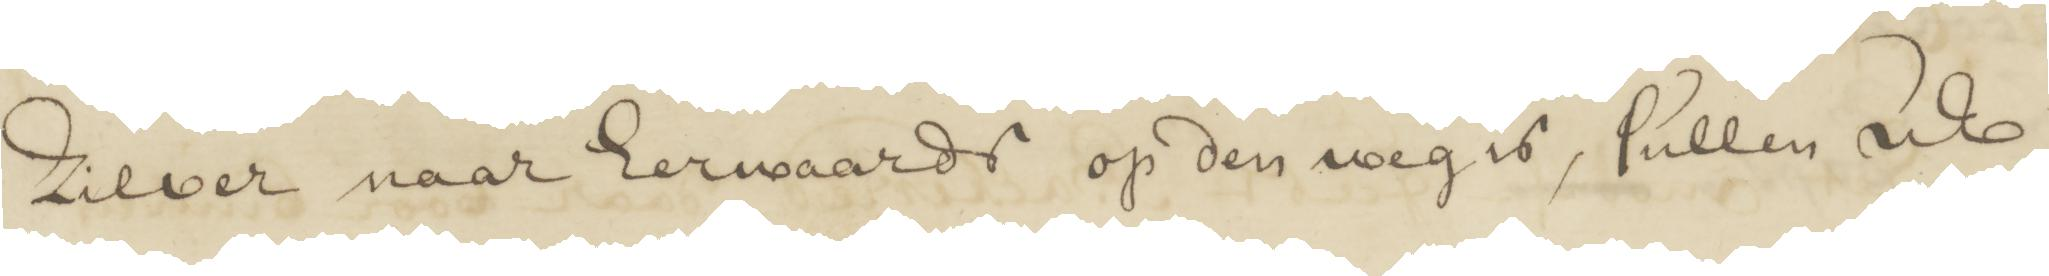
zilver naar herwaards op den weg is, sullen vE
